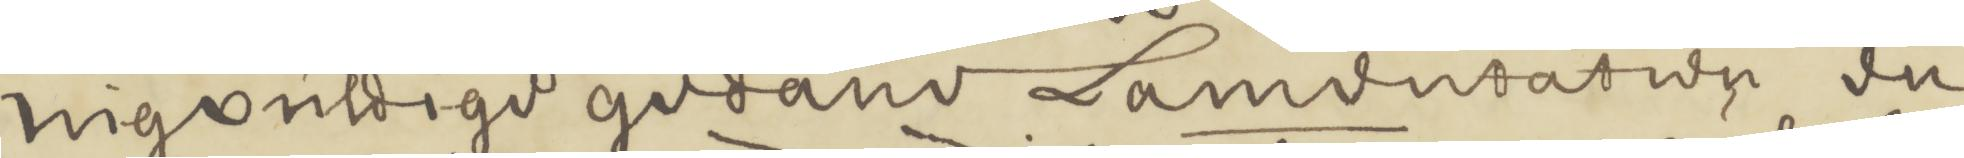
nigvuldige gedane lamentatien en
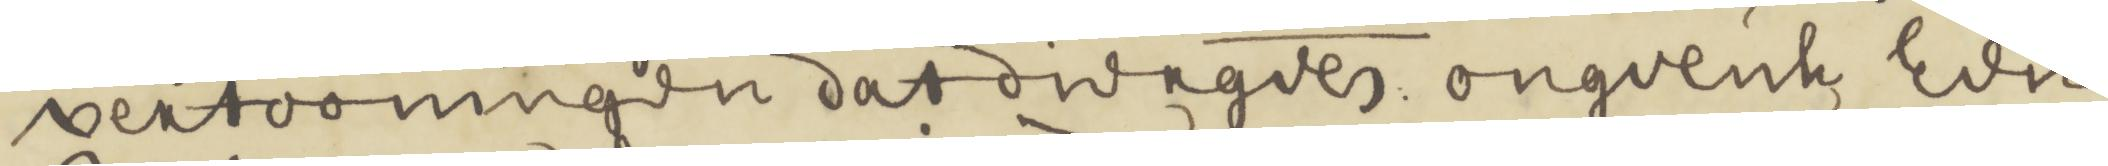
vertooningen dat diergelijk ongeluk hen
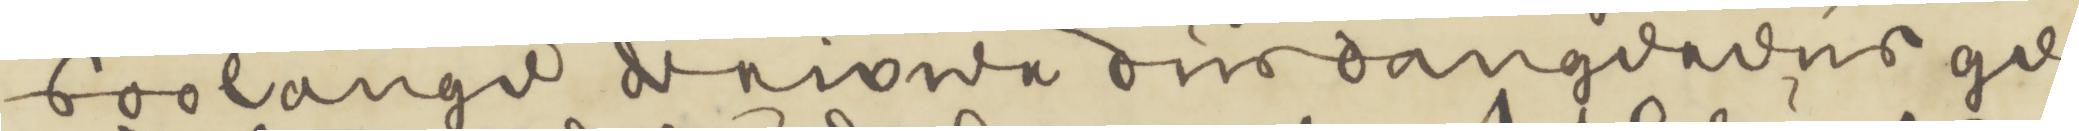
soolange de rivier dus dangereus ge
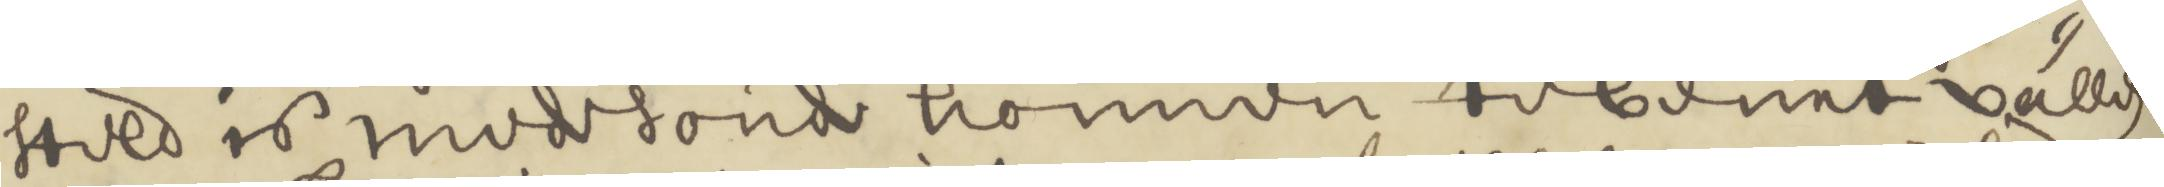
steld is mede soude konnen te beurt vallen
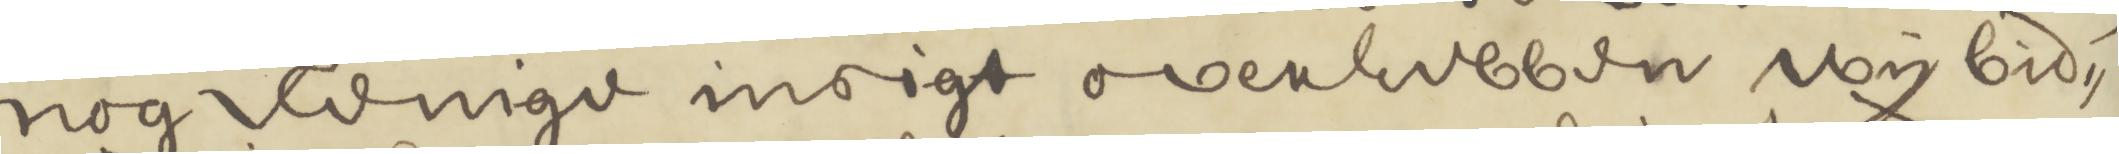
nog Eenige insigt overhebben wij bid„
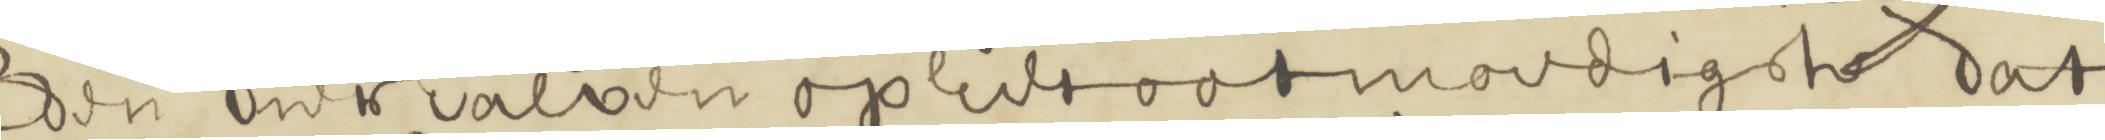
den dierhalven op het ootmoedigste dat
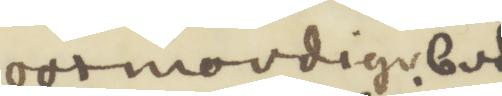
ootmoedige bede
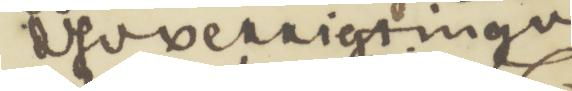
dese verrigtinge
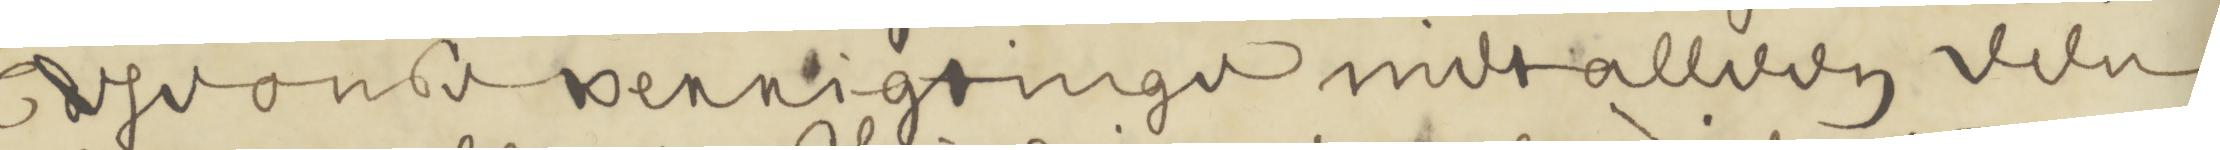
dese onse verrigtinge niet alleen een
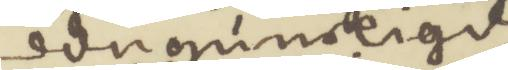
een gunstige
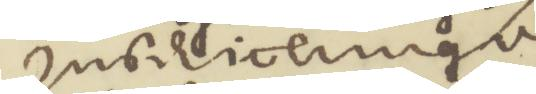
jnschickinge
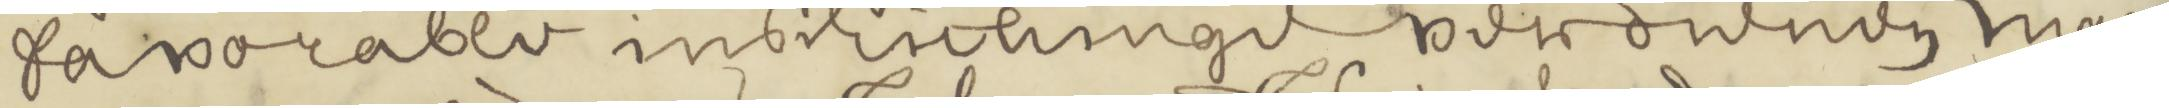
favorable inschickinge verdienen mag
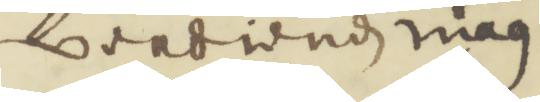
verdienen mag.
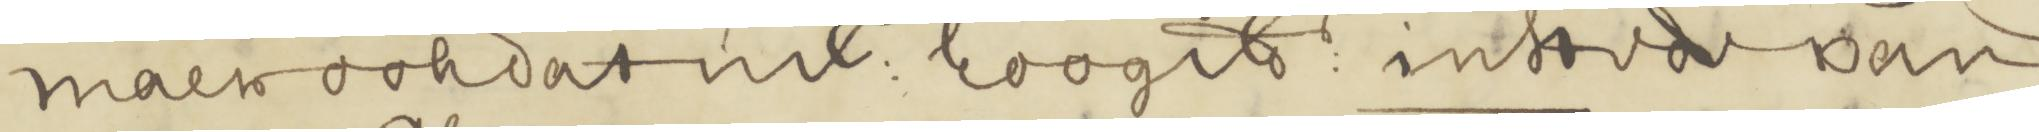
maer ook dat uE: hoog Ed:s instede van
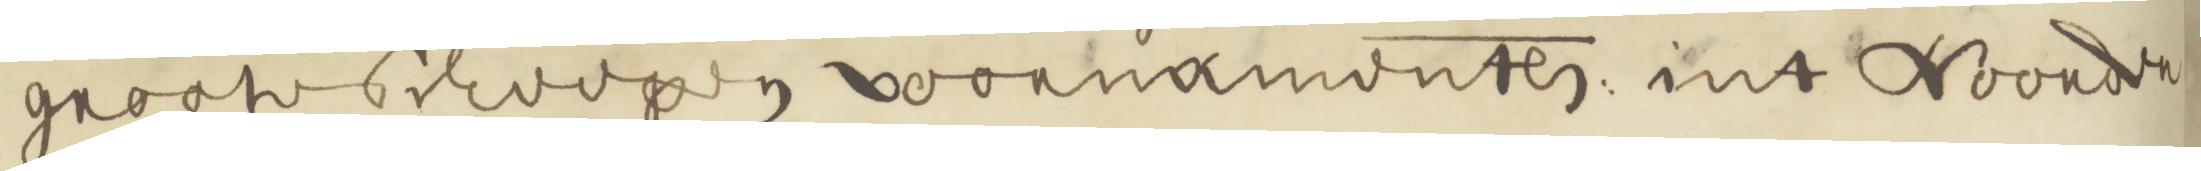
groote scheepen voornamentlijk in't Noorder
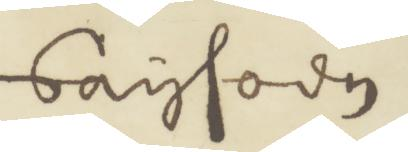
saijsoen
